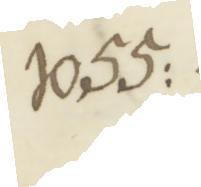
1055:
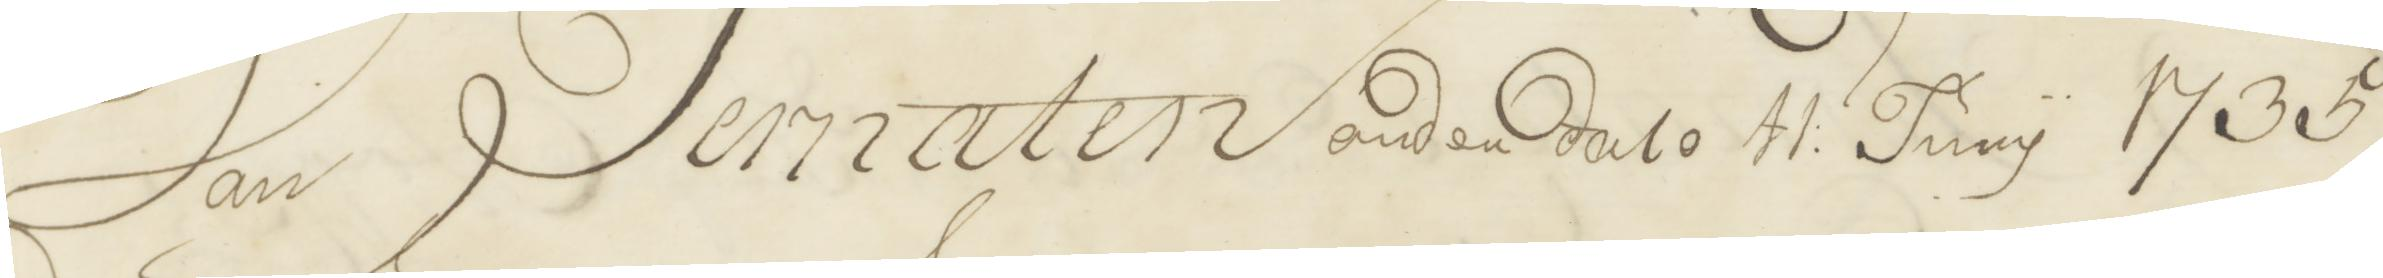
Van Ternaten onder dato 11:' Iunij 1735
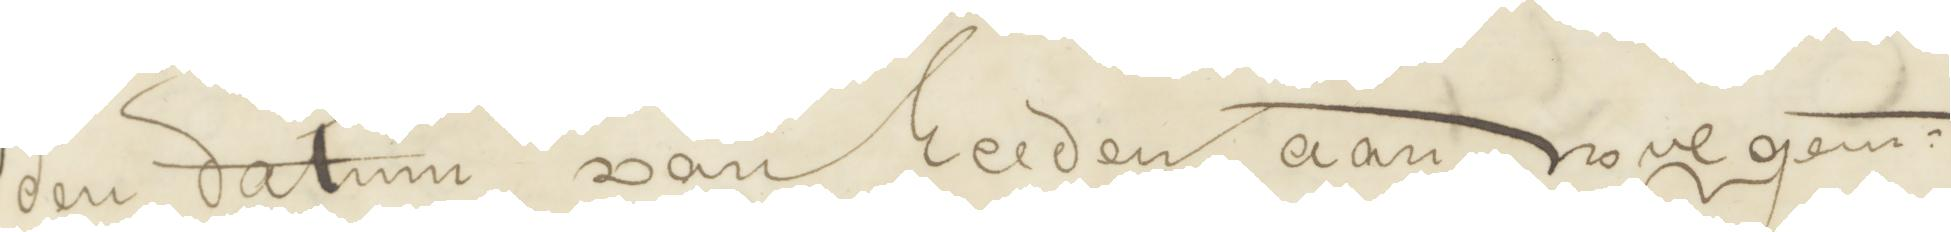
den datum van heeden aan wel gem:
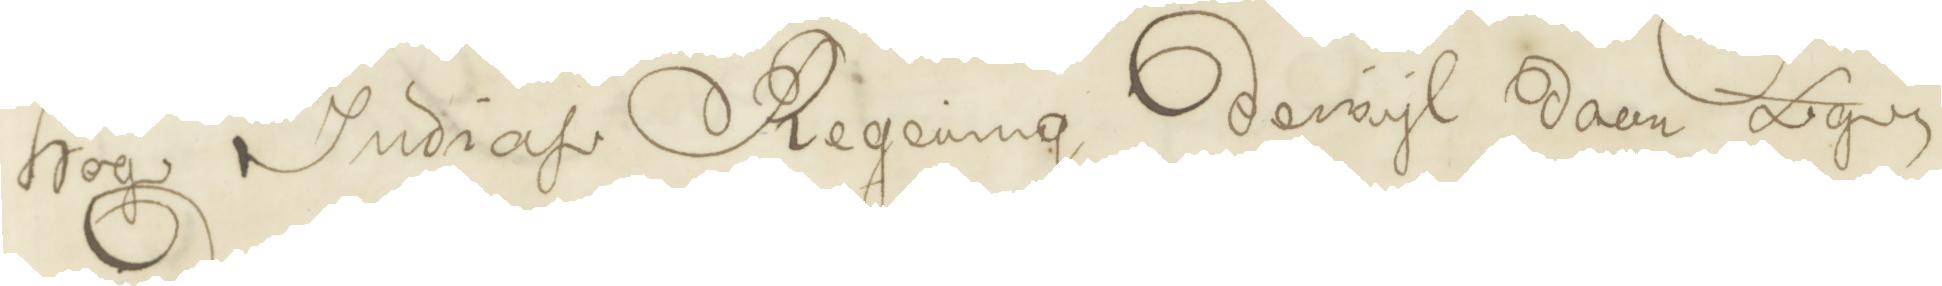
hoge Indiase Regering dewijl daar tegen
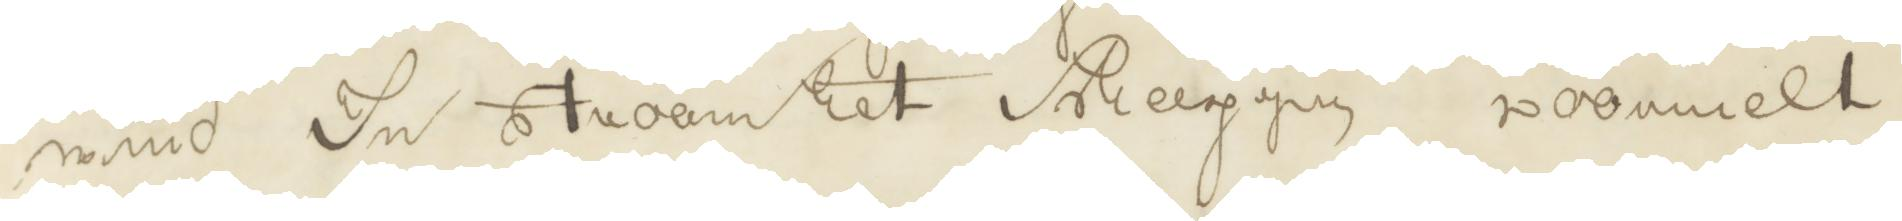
wind En stroom het scheepjen voormelt
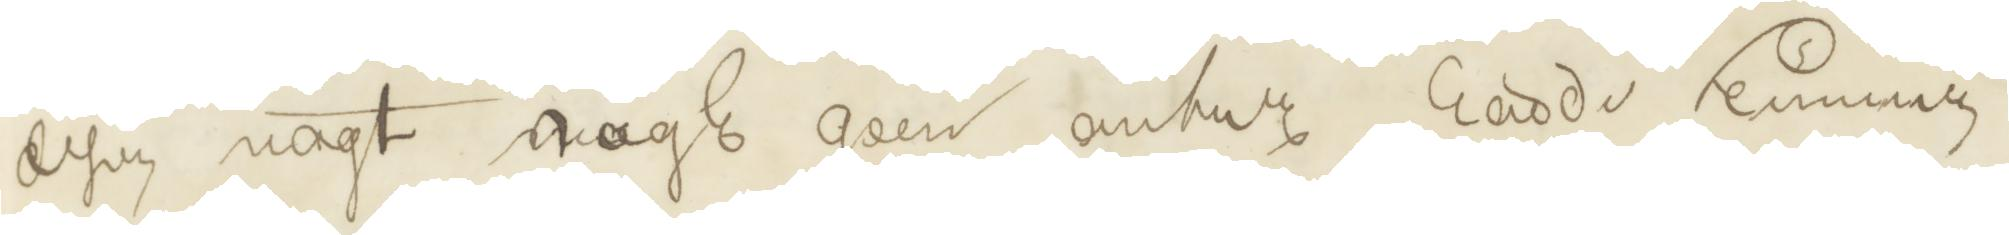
desen nagt nogh geen omkeer hadde kunnen
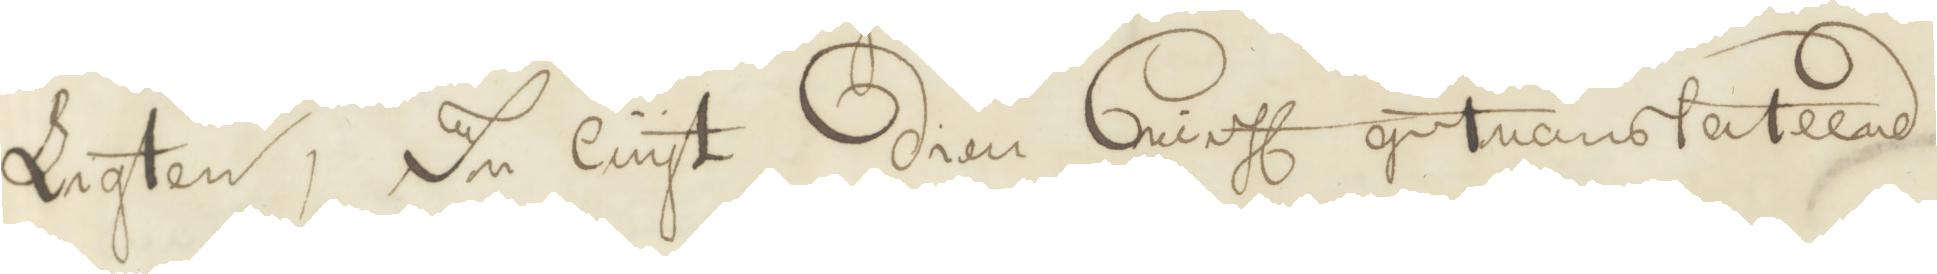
Zigten, En luijt dien brieff getranslateerd
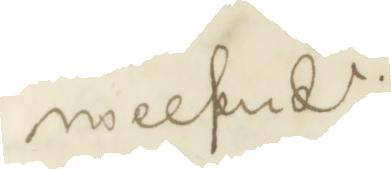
weesende;
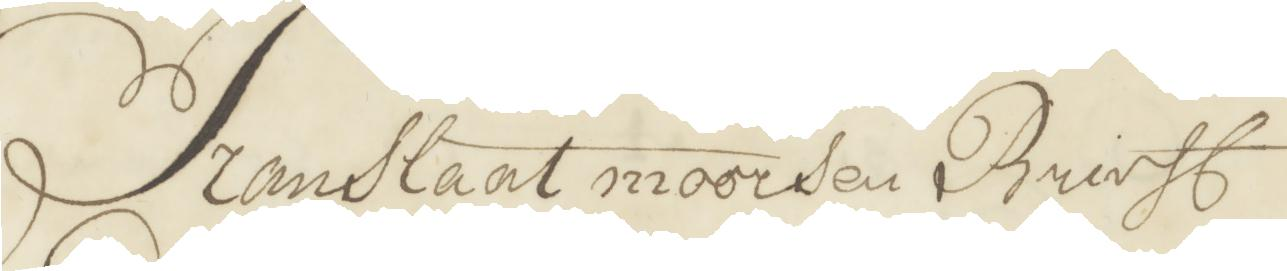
Transtaat moorsen Brieff
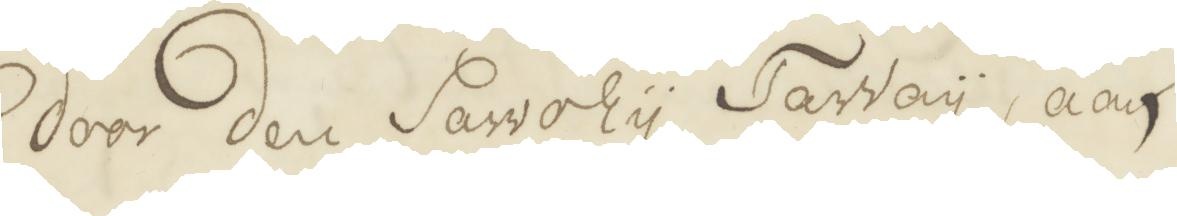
door den Sawohij Tawaij, aan
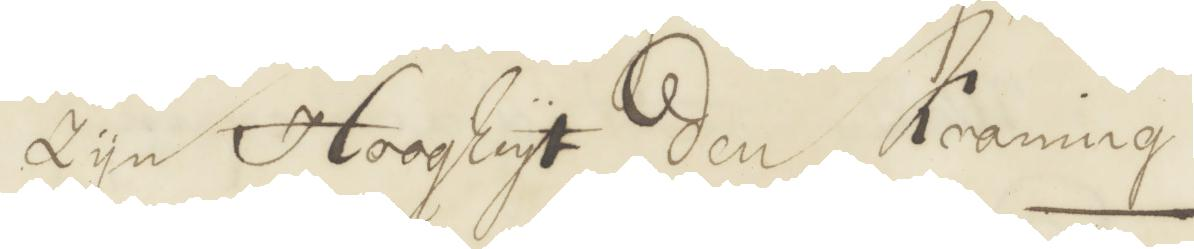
zijn Hoogheijt den Kooning
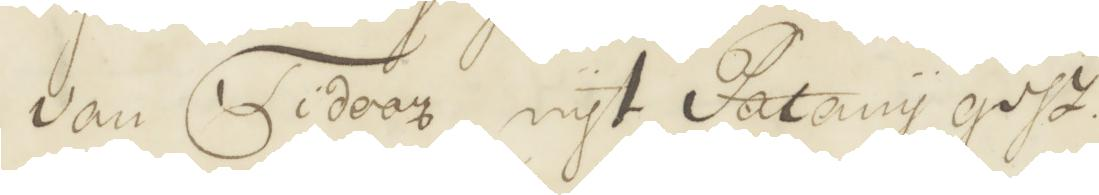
van Tidoor uijt Patanij gesz
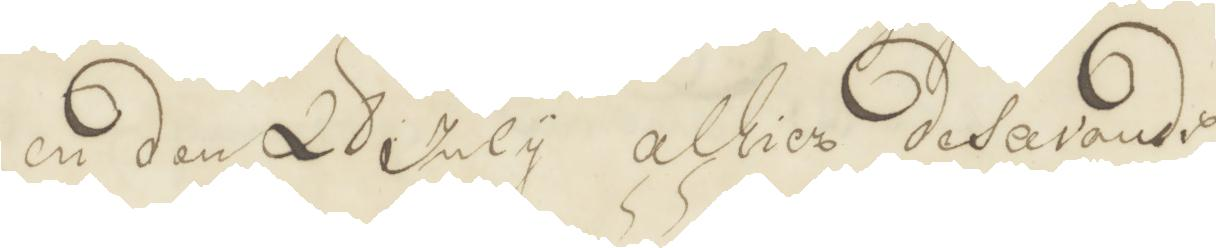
en den 28 Iulij alhier des avonds
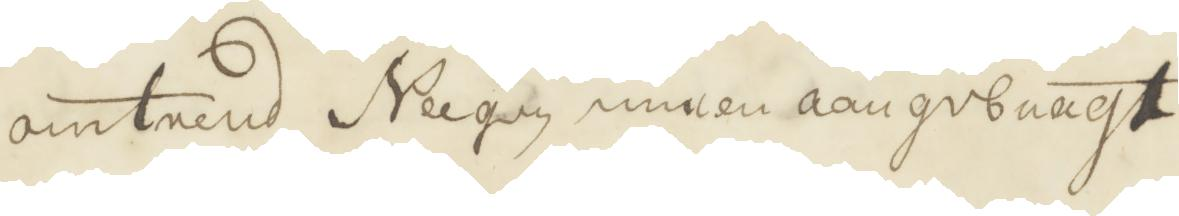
omtrend Neegen uuren aangebragt
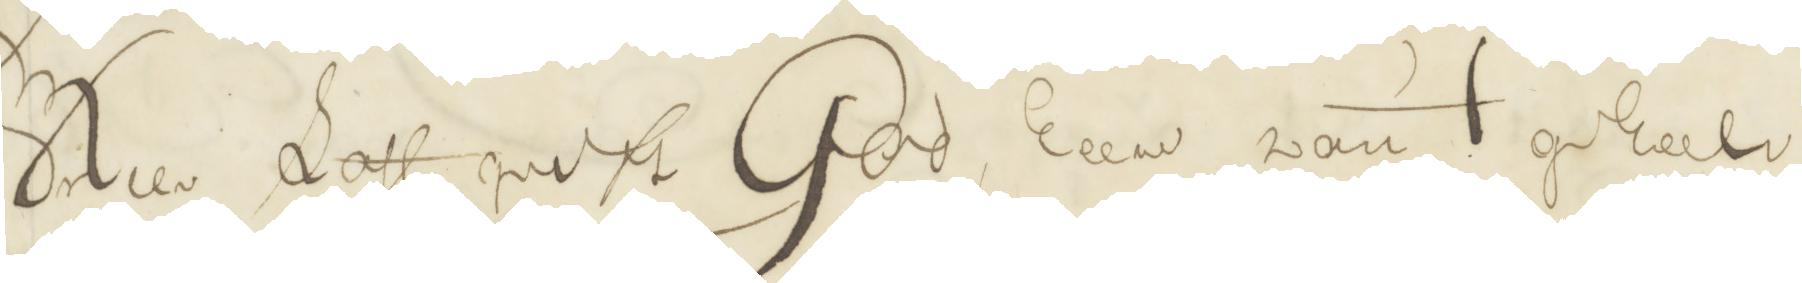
Wier Loff geeft God, heer van ’t geheele
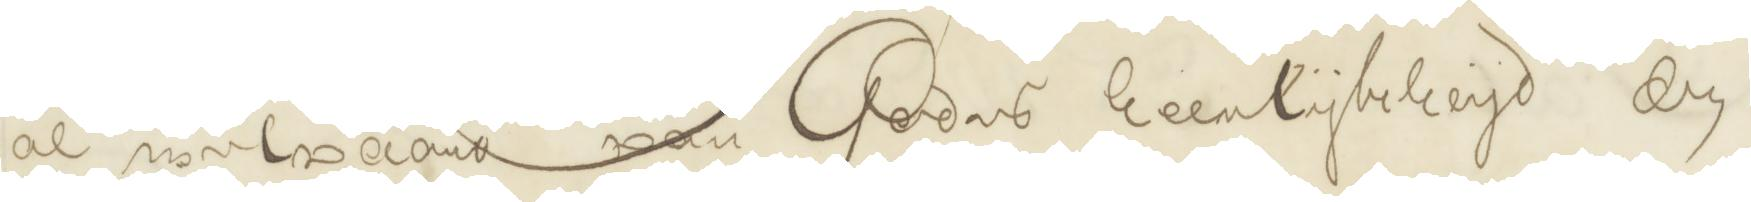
al welvaard van Godes heerlijkheijd den
